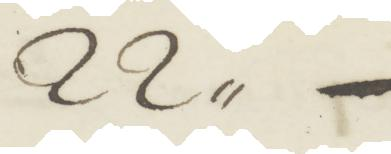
22„
